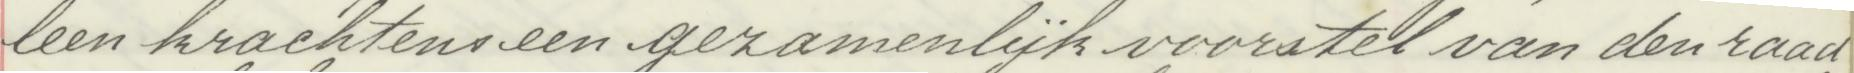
leen krachtens een gezamenlijk voorstel van den raad
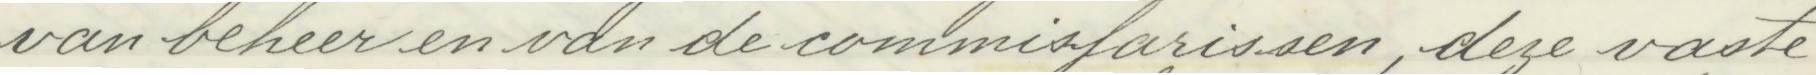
van beheer en van de commissarissen, deze vaste
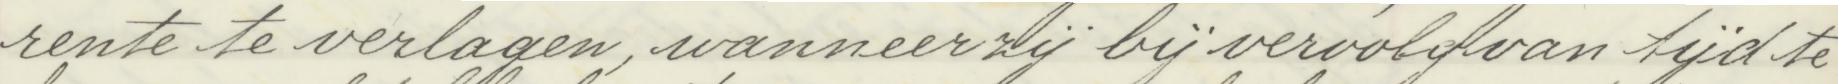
rente te verlagen, wanneer zij bij vervolg van tijd te
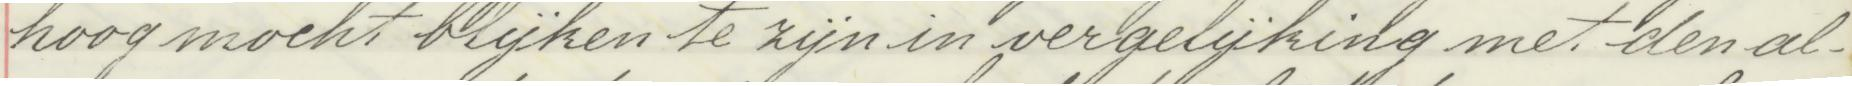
hoog mocht blijken te zijn in vergelijking met den al-
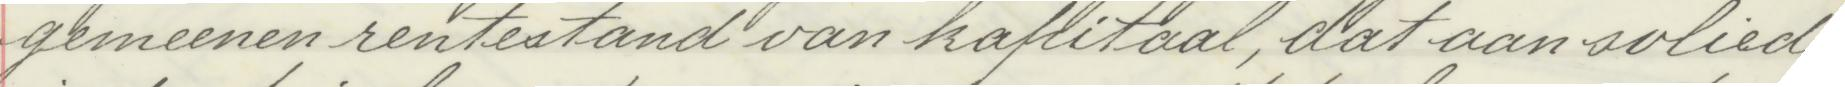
gemeenen rentestand van kapitaal, dat aan soliede
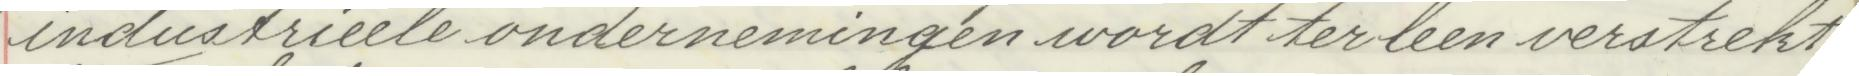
industrieele ondernemingen wordt ter leen verstrekt.
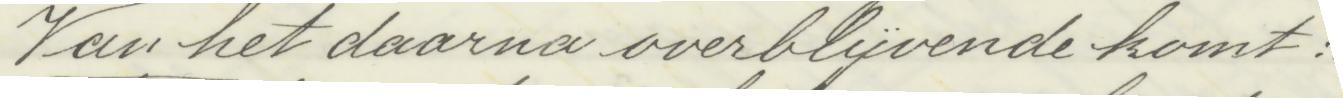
Van het daarna overblijvende komt:
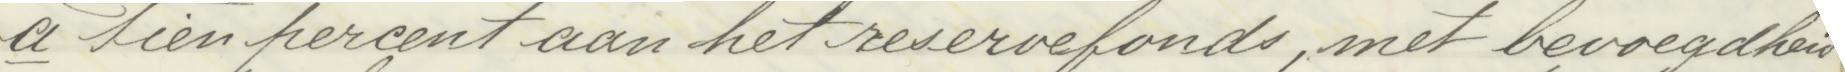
a Tien percent aan het reservefonds, met bevoegdheid
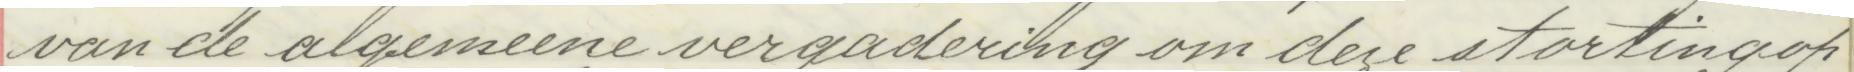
van de algemeene vergadering om deze storting op
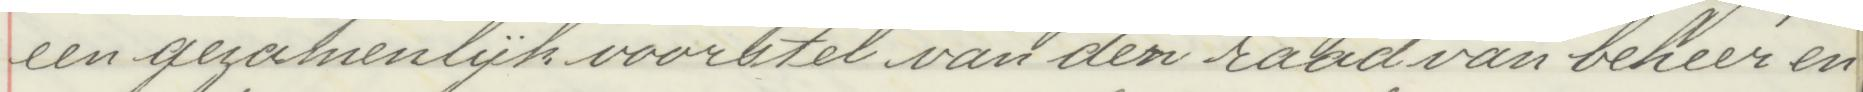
een gezamenlijk voorstel van den raad van beheer en
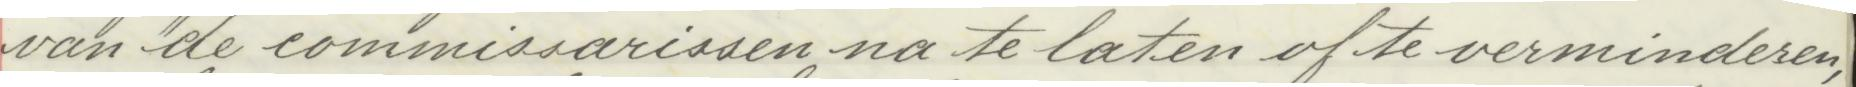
van de commissarissen na te laten of te verminderen,
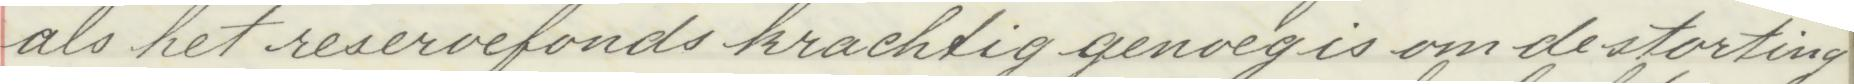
als het reservefonds krachtig genoeg is om de storting
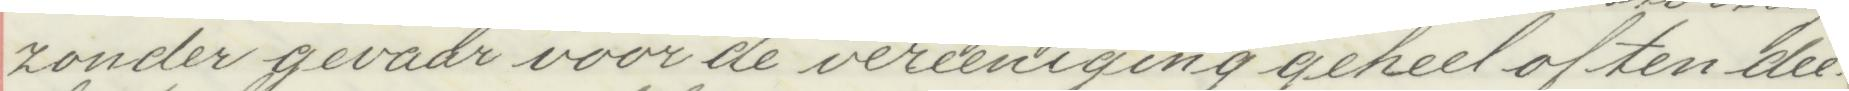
zonder gevaar voor de vereeniging geheel of ten dee.
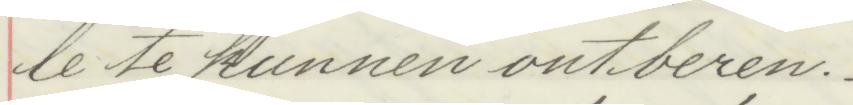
le te kunnen ontberen.
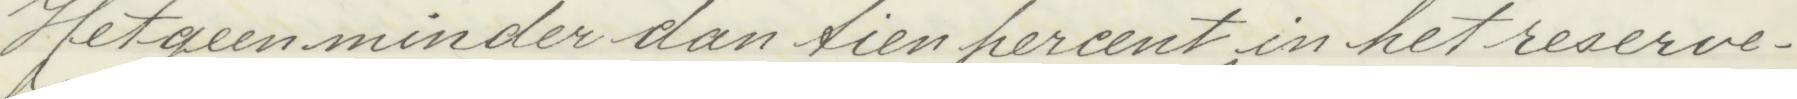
Het geen minder dan tien percent in het reserve-
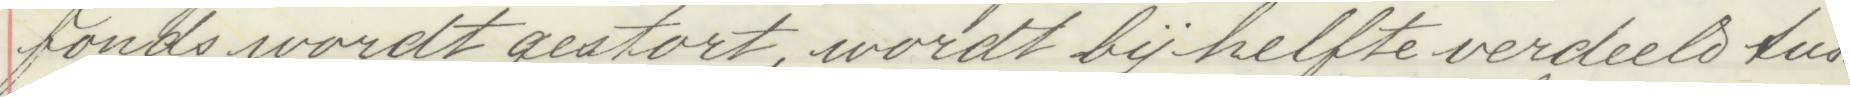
fonds wordt gestort, wordt bij helfte verdeeld tus
